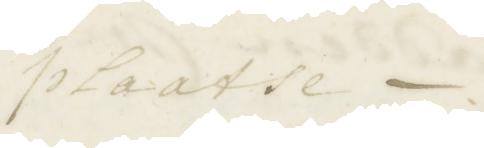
plaatse —
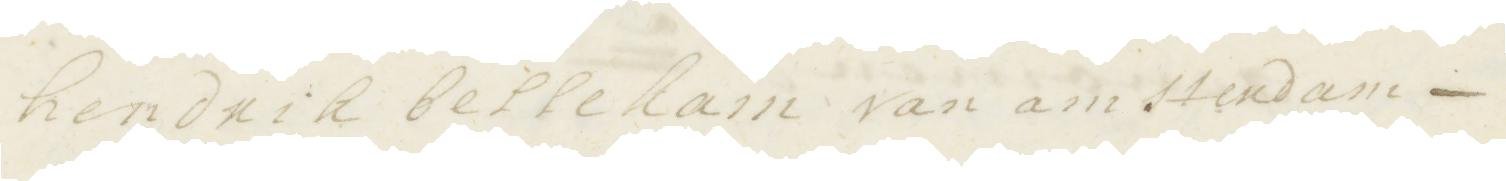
hendrik bellekam van amsterdam —
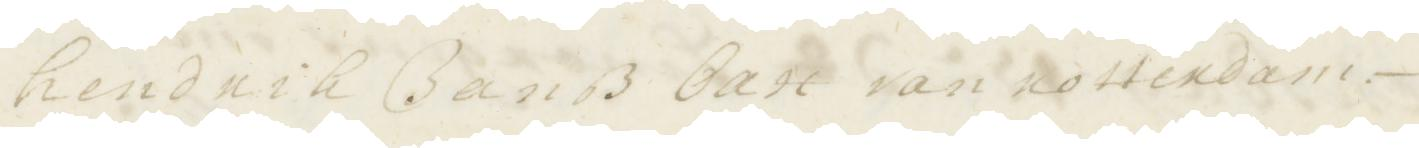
hendrik Jansz bast van rotterdam. —
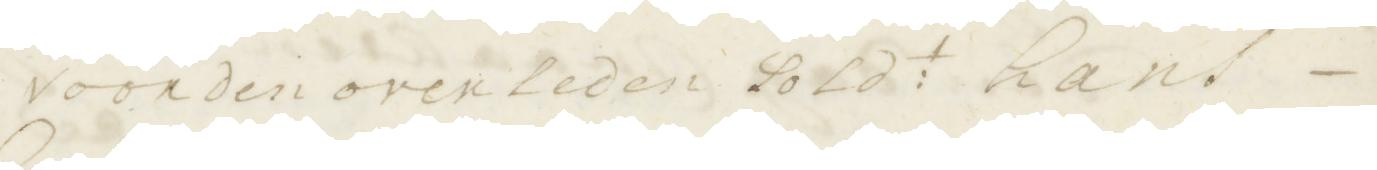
voor den overleden sold:t hans —
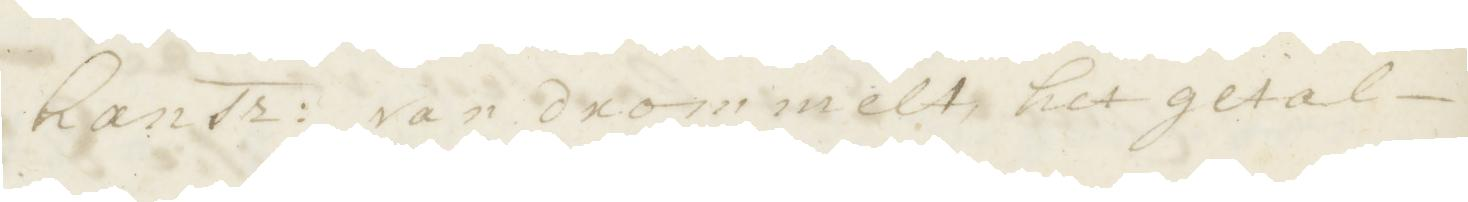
hansz: van drommelt, het getal —
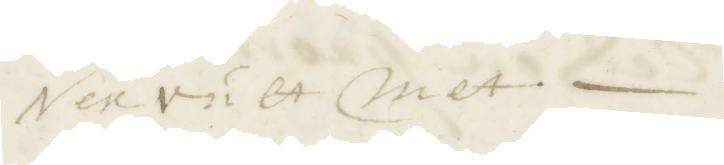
vervult met —
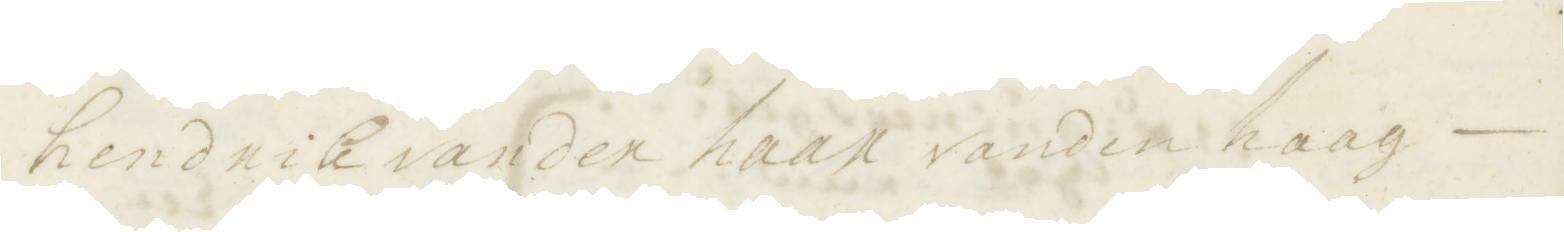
hendrik van der haar vanden haag —
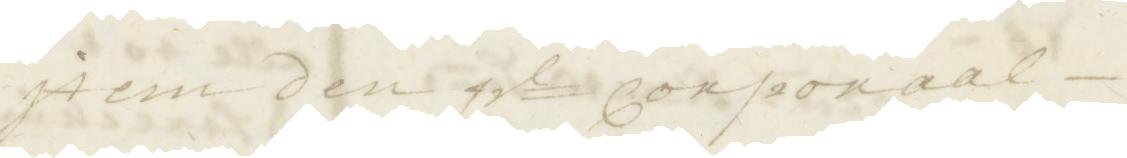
jtem den p=l corporaal —
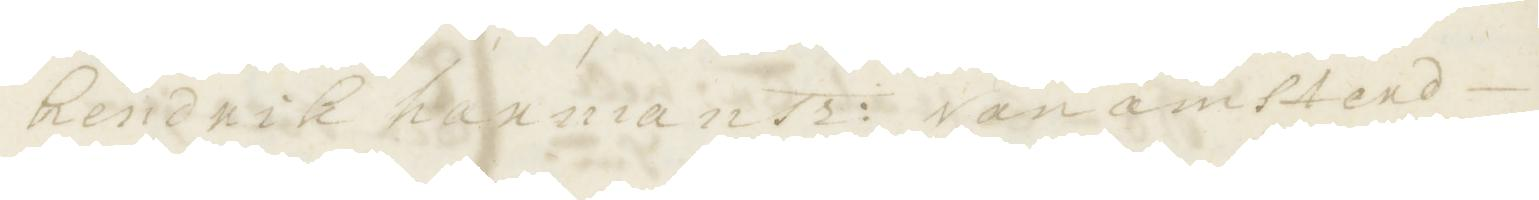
hendrik harmansz: van amsterd —
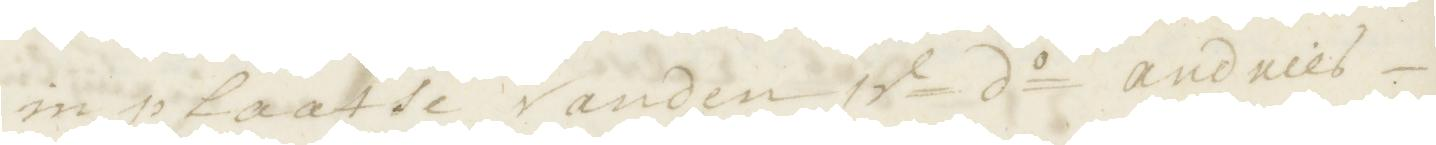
in plaatse vanden p=l d=o andries —
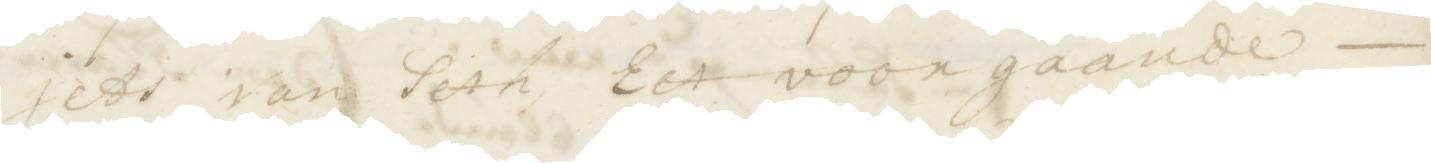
jets van seth het voor gaande —
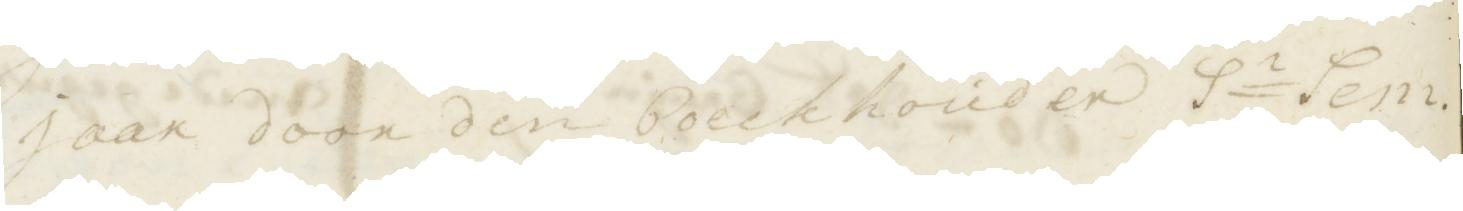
jaar door den boeckhouder s=r sem
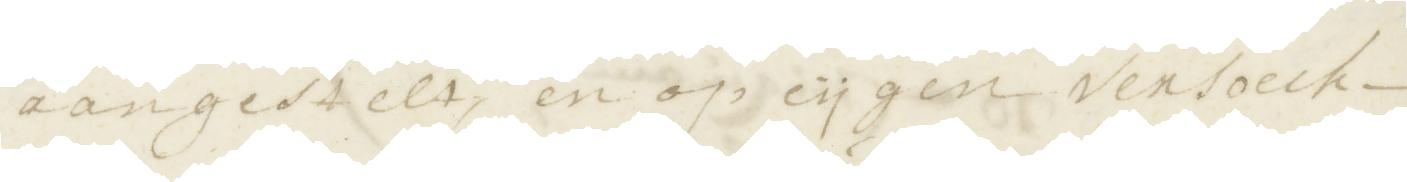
aangestelt, en op eijgen versoeck —
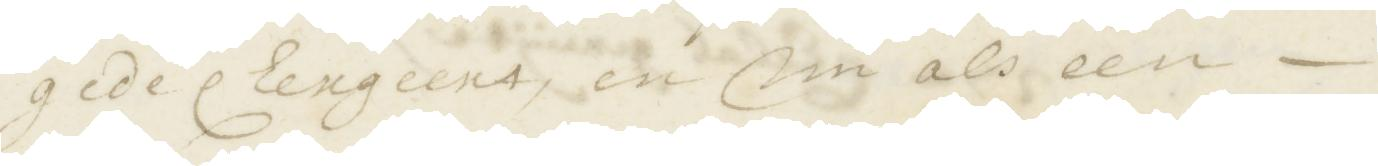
gedechergeert, en nu als een —
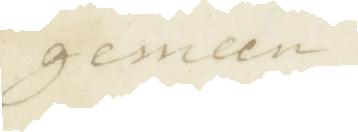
gemeen
